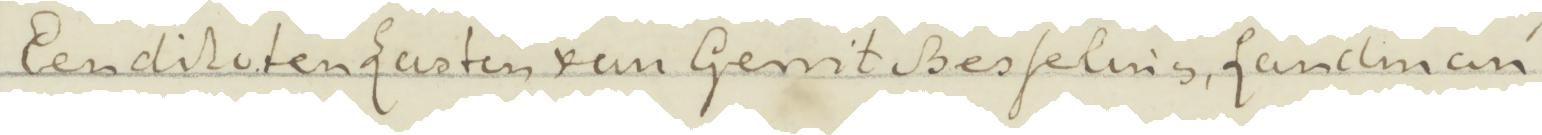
Een dito ten Lasten van Gerrit Besseling, Landman
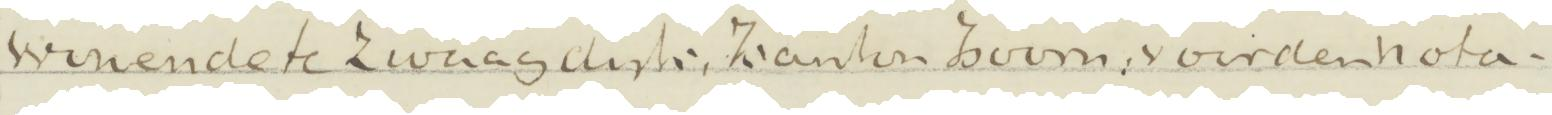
wonende te zwaagdyk, kanton hoorn: voor den nota-
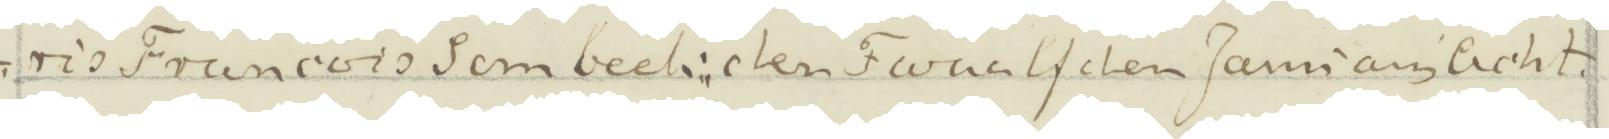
=ris Francois Sombeek den Twaalfden Januarij Acht.
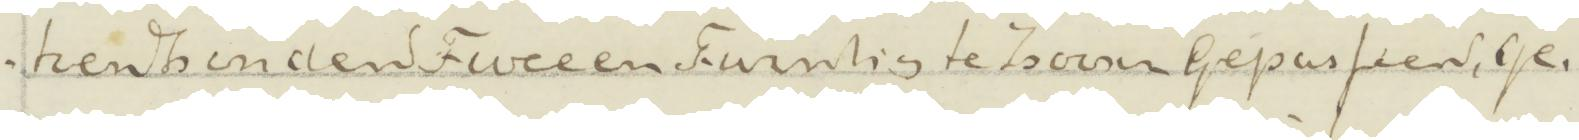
=tien honderd Twee en Twintig te hoorn Gepasseerd, ge.
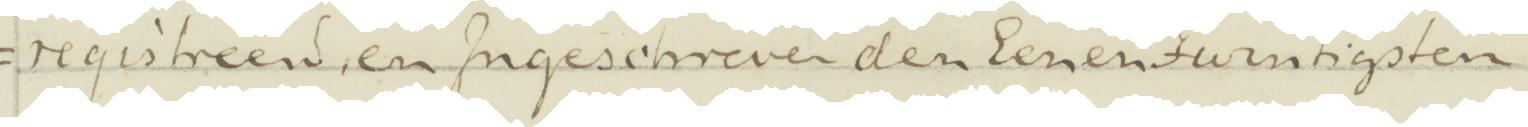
=registreerd, en Jngeschreven den Een en Twintigsten
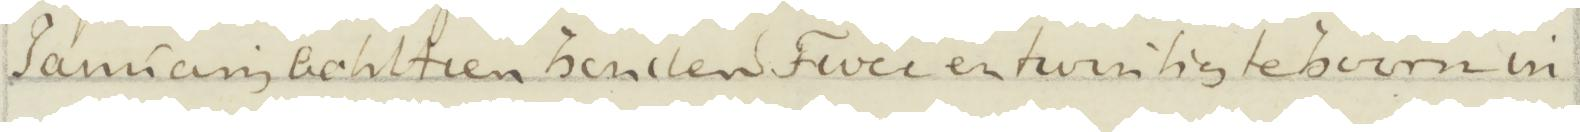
Januarij achttien honderd Twee en twintig te hoorn in
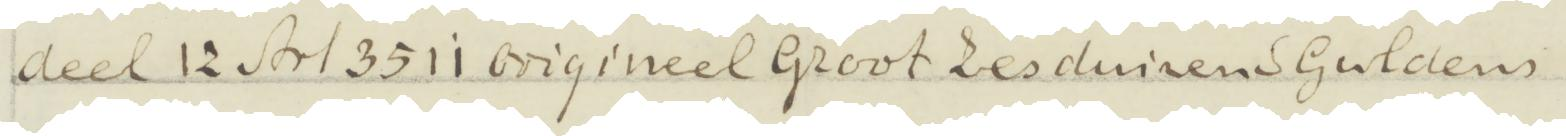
deel 12 Art 3511 origineel Groot zes duizend Guldens
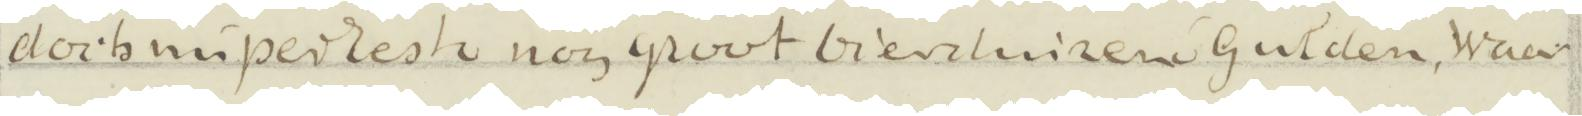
doch nu per resto nog groot vierduizend gulden, waar
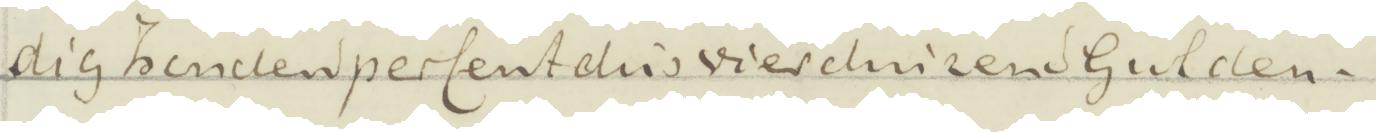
dig honderd percent dus vier duizend Gulden - - - - „ 4000 „ —
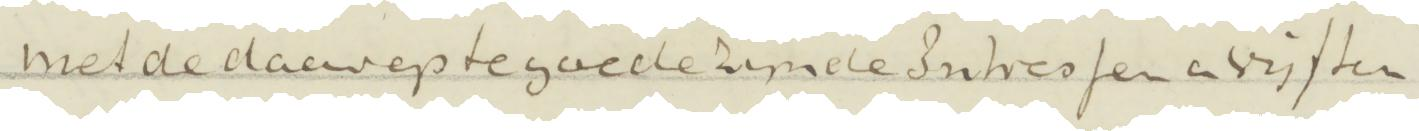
met de daarop te goede zynde Jntressen a vijften
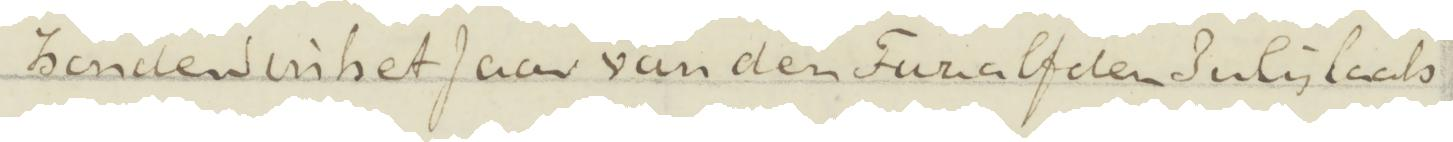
honderd in het Jaar van der Twaalfden Julij laats
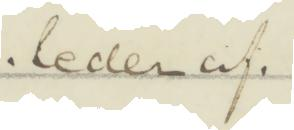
.leden af.
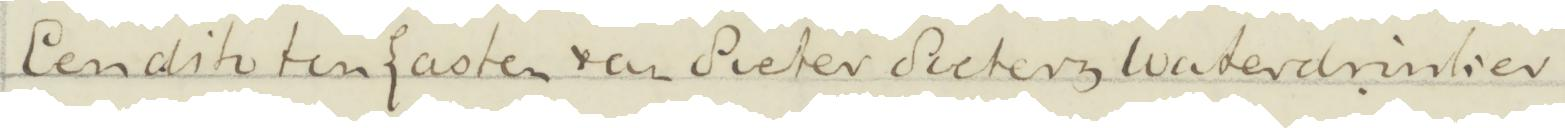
Een dito ten Lasten van Pieter Pieterz waterdrinker
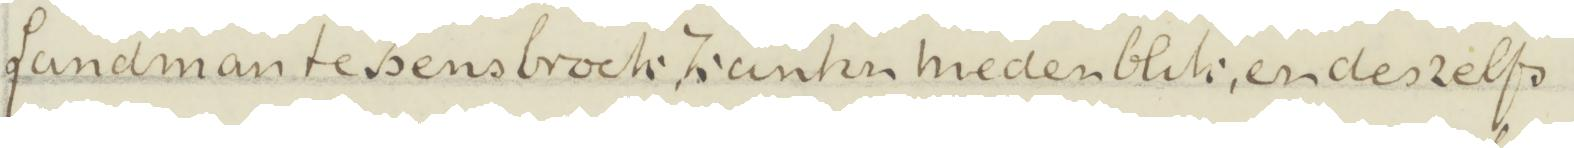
Landman te Hensbroek kanton medenblik, en deszelfs
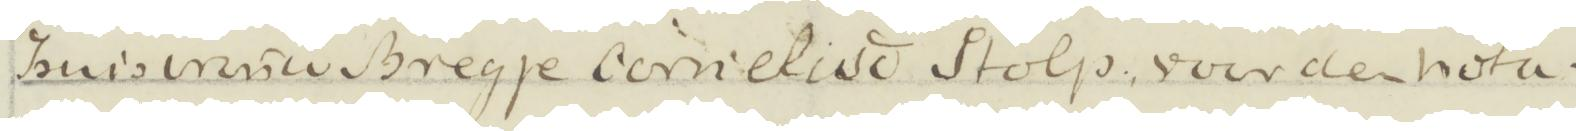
huisvrouw Bregje cornelisd Stolp, voor den nota-
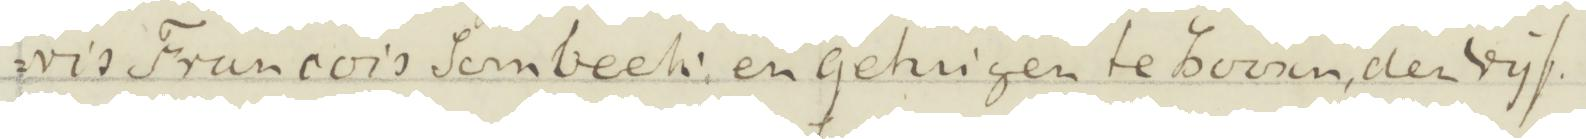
=ris Francois Sombeek, en getuigen te hoorn, den vijf.
